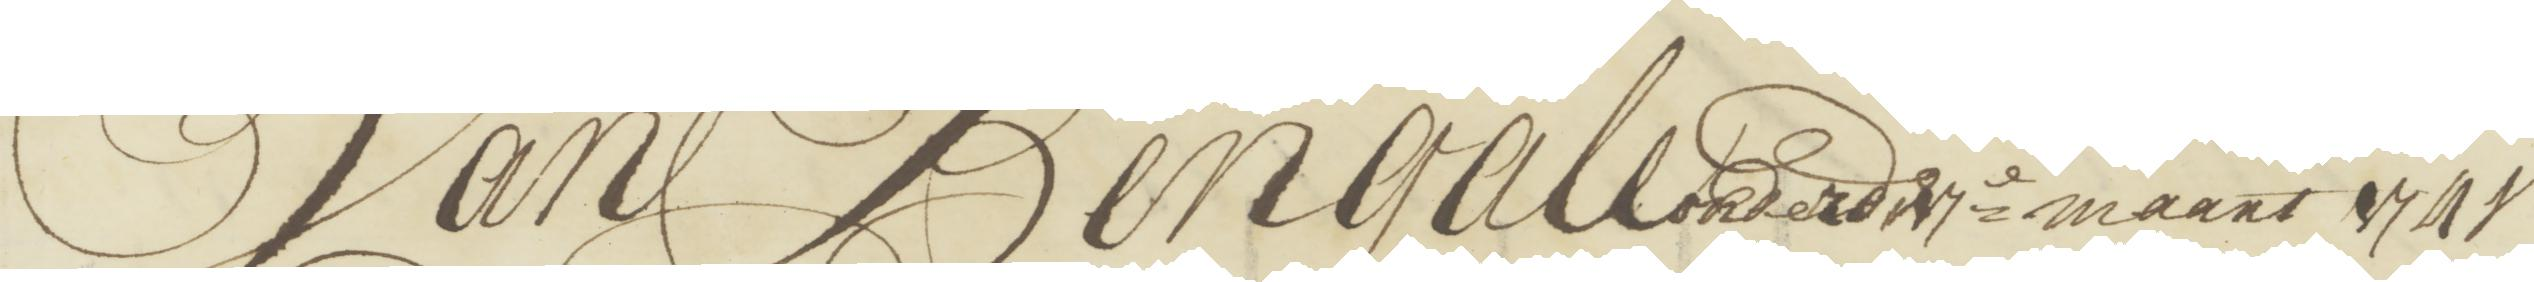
Van Bengale onder d„o 17=e maart 1741
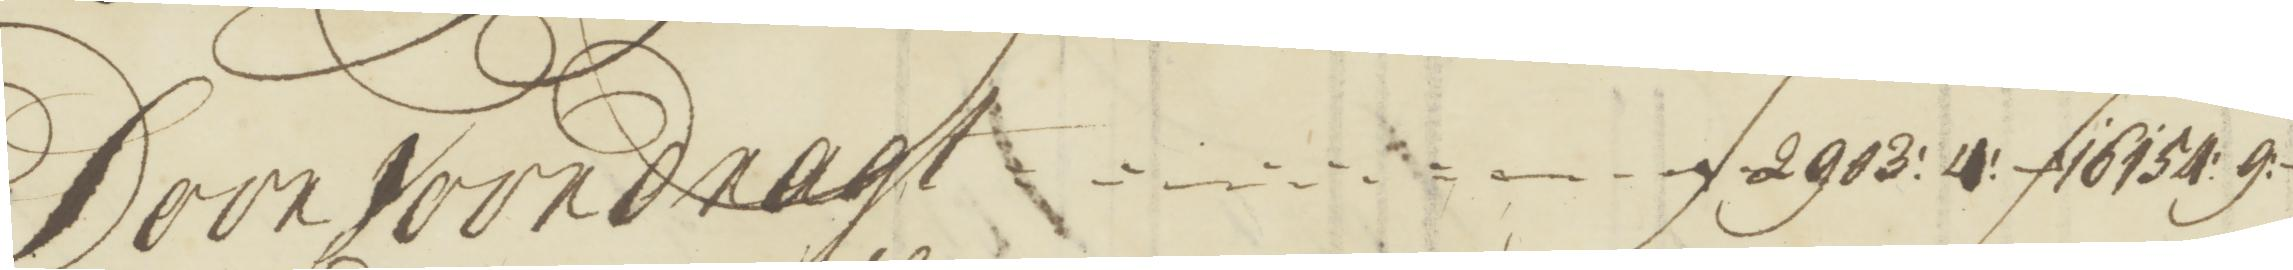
Door voordragt = = . . . . . . = - - -ƒ2903: 4: ƒ16154: 9:
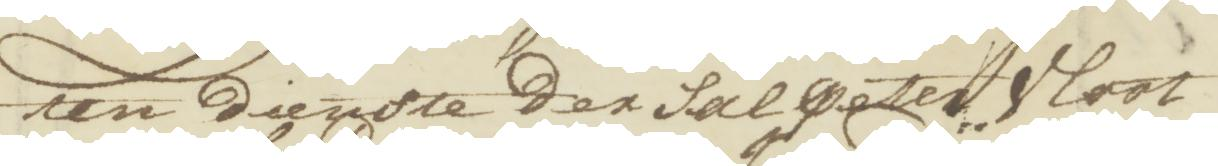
ten dienste der salpeter vloot
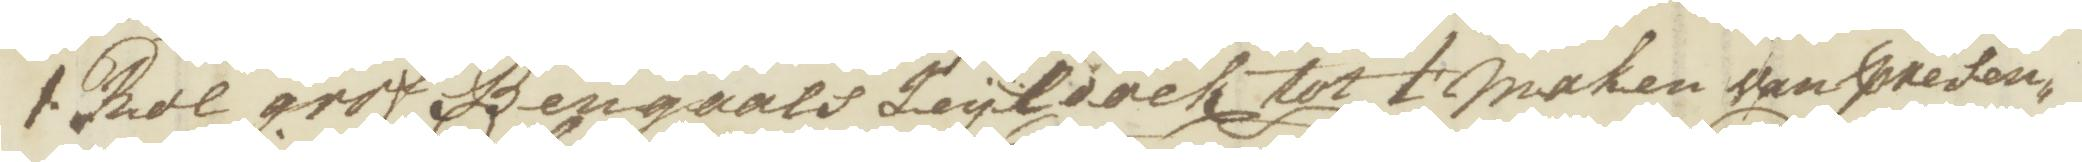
1. Rol grof Bengaals zeijldoek tot t' maken van presen„
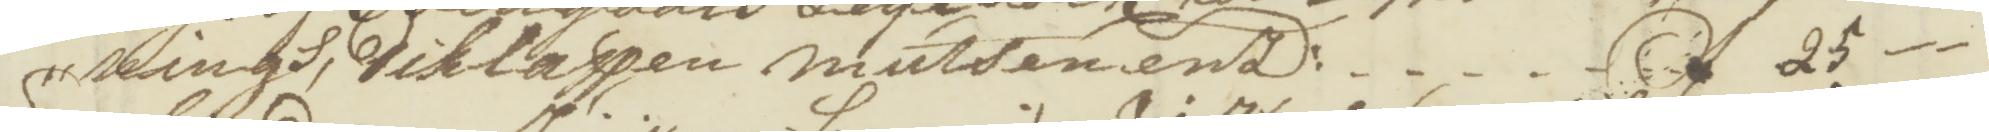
„nings, diklappen mutsen enz: - - - - - = -ƒ 25 — —
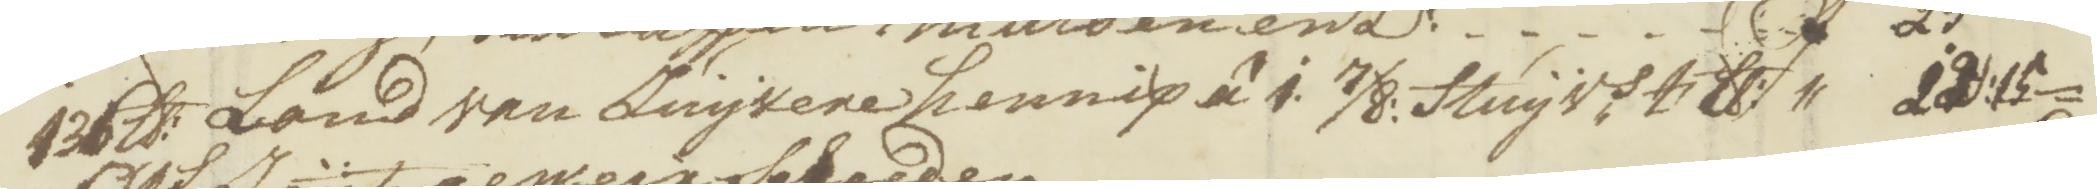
136 lb: Lond van zuijvere hennip â 1. 7/8: stuijv„s t' lb: „ 22: 15 —
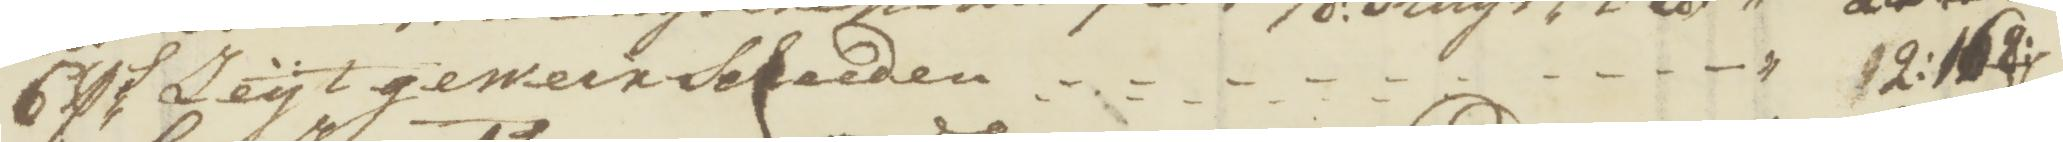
6 p„s zeijl geweerscheeden - - - - - - - - - - „ 12: 168:
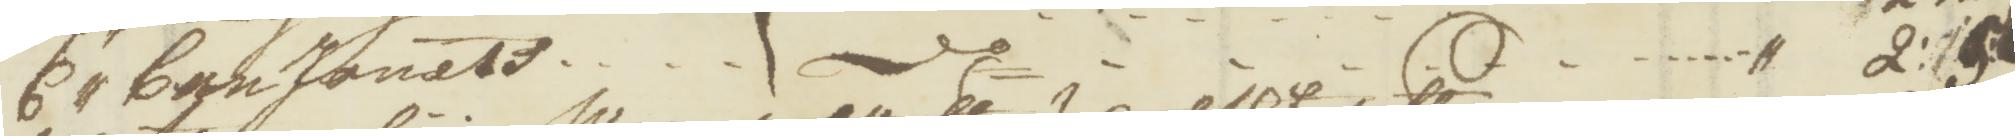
6 „ banjonets. . . . _=o - - - - - - - - ---.„ 2: 19: 8:
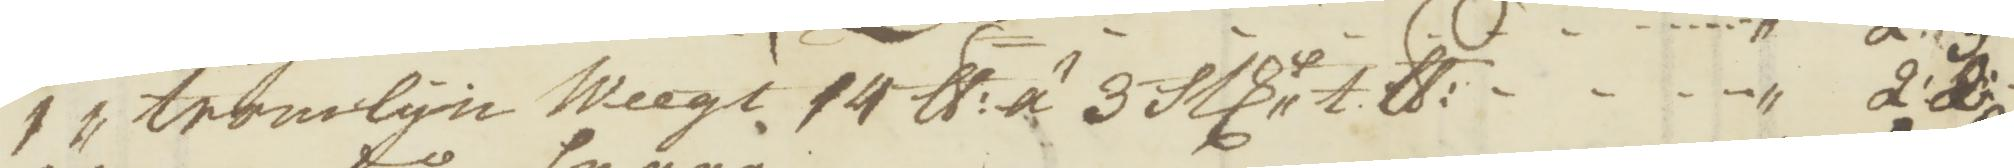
1 „ tromlijn weegt 14 lb: â 3 stver„s t lb: - - - -„ 2: 2:
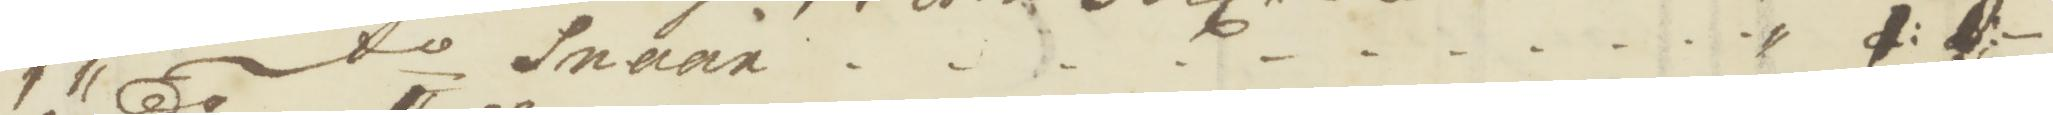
1 „ d=o snaar - - - - - - - - - . . . „ 1: 8: —
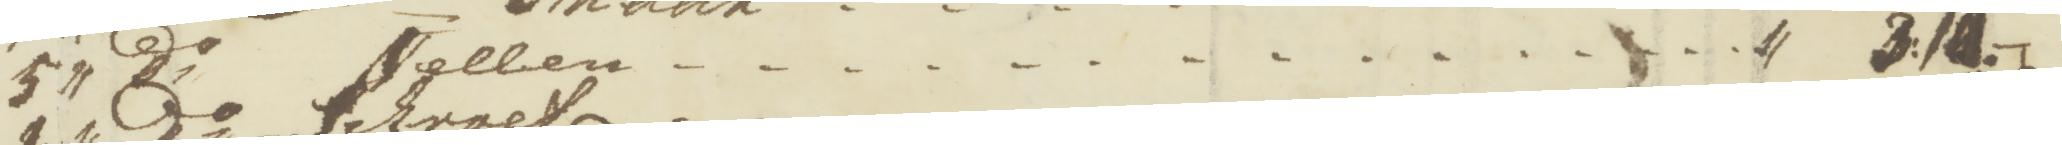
5 „ d„o vellen - - - - - . - - . -. - - -„ 3: 18. —
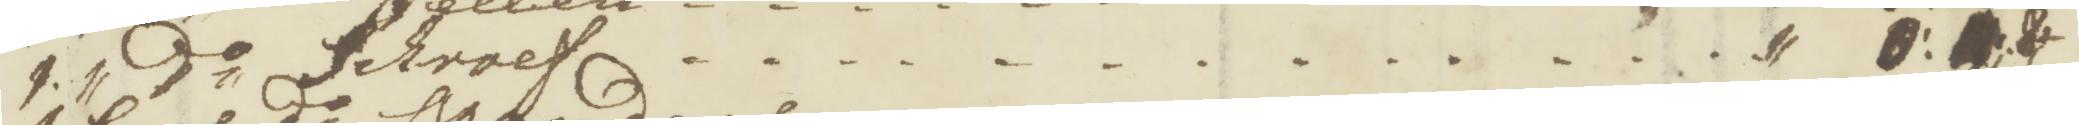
1. „ d„o schroef - - - - - - . . . . - . . . .„ 8: 4. 8
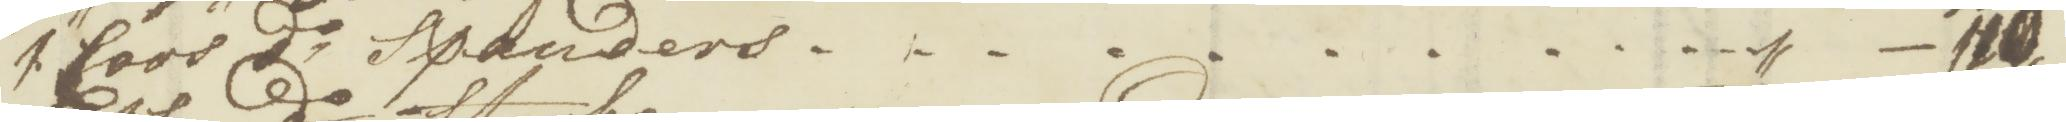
1. Coos d„o spanders - - - . . . . . . - - „ — 118
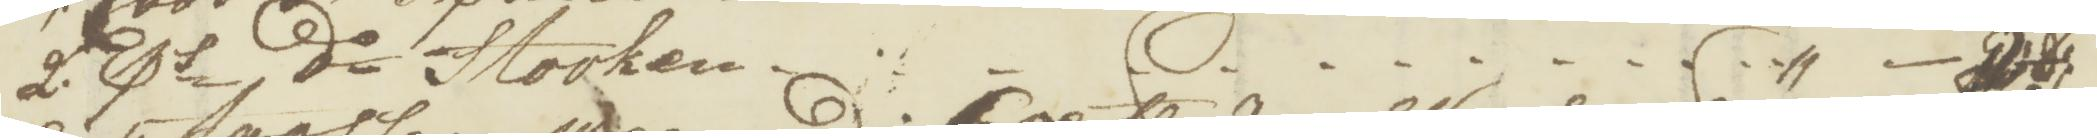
2. p=s d=o stooken - ; - - - . - - - - - . . „ — 2: 8:
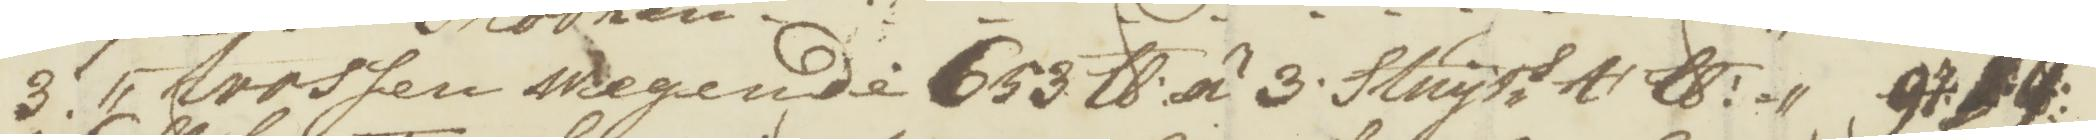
3. „ trossen wegende 653 lb: â 3. stuijv=s t' lb: „ 97: 89:
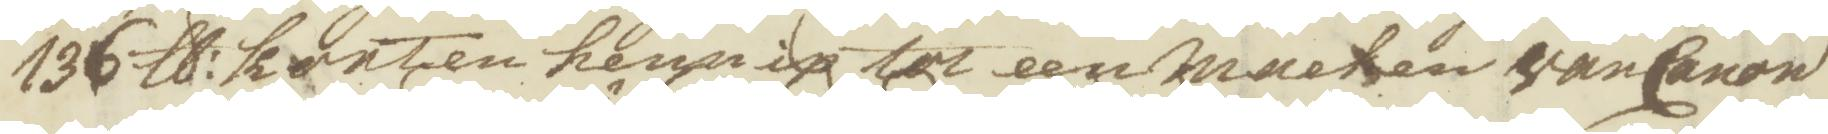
136 lb: karten hennip tot een maeken van Canon
